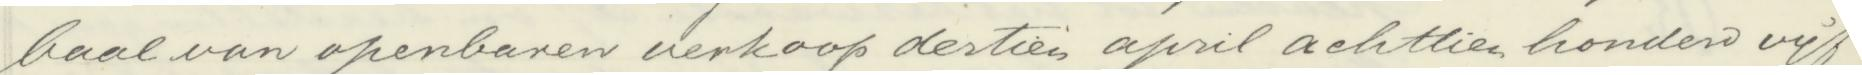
baal van openbaren verkoop dertien april achttien honderd vijf
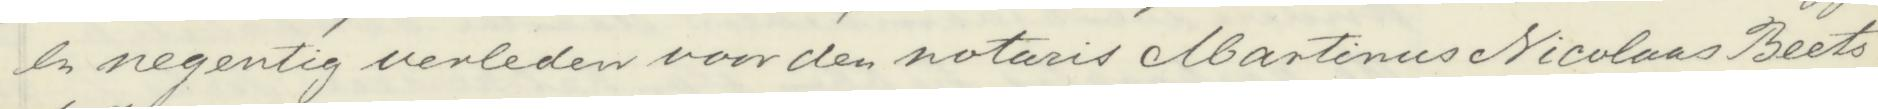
en negentig verleden voor den notaris Martinus Nicolaas Beets
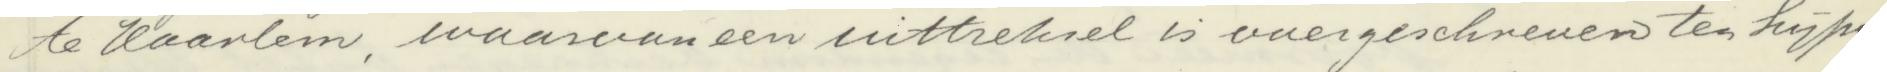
te Haarlem, waarvan een uittreksel is overgeschreven ten hijpo
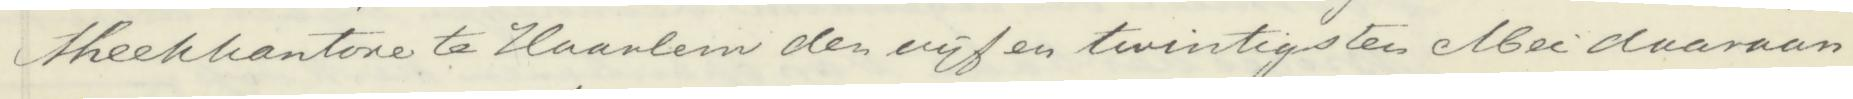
theekkantore te Haarlem den vijf en twintigsten Mei daaraan
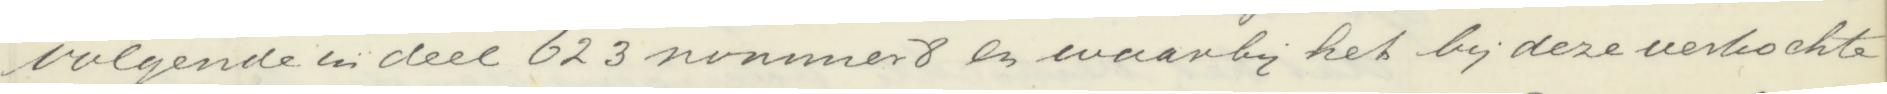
volgende in deel 623 nommer 8 en waarbij het bij deze verkochte
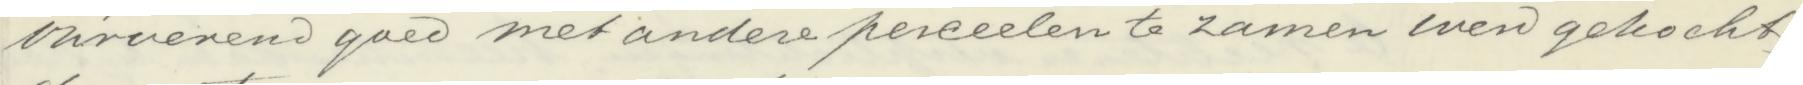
onroerend goed met andere perceelen te zamen werd gekocht
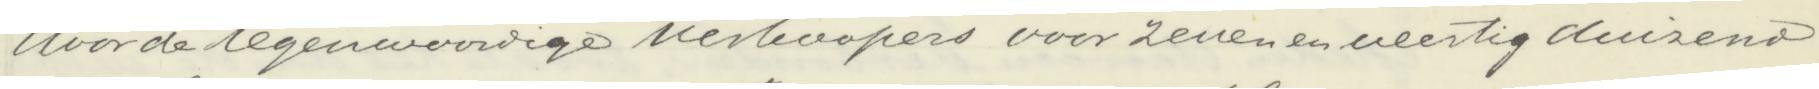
door de tegenwoordige verkoopers voor zeven en veertig duizend
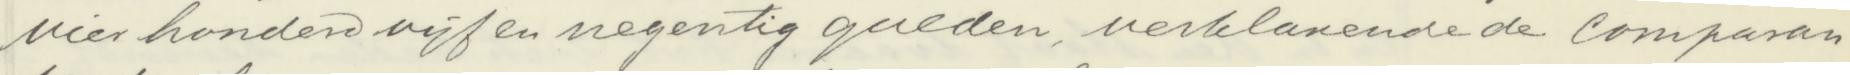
vier honderd vijf en negentig gulden, verklarende de Comparan
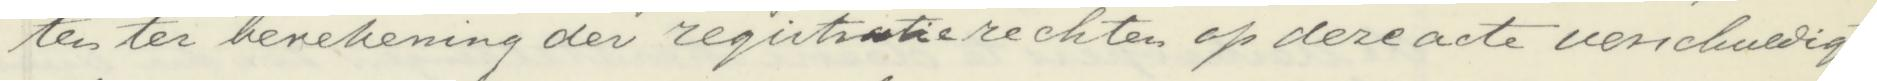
ten ter berekening der registratie rechten op deze acte verschuldigd
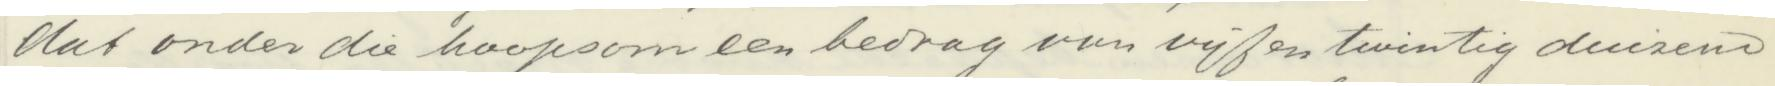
dat onder die koopsom een bedrag van vijf en twintig duizend
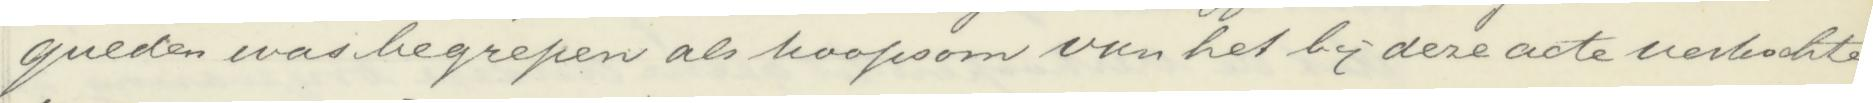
gulden was begrepen als koopsom van het bij deze acte verkochte
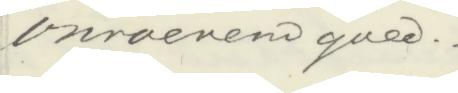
onroerend goed.
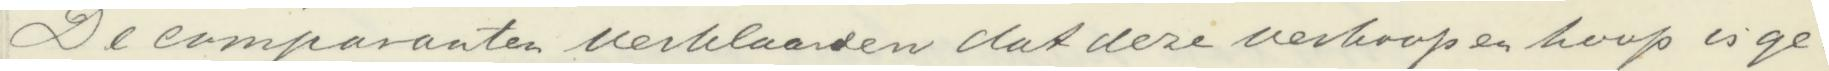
De comparanten verklaarden dat deze verkoop en koop is ge
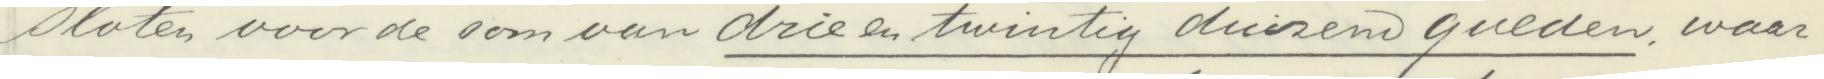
sloten voor de som van drie en twintig duizend gulden, waar
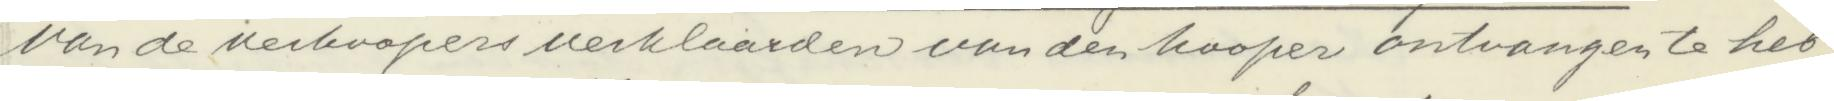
van de verkoopers verklaarden van den kooper ontvangen te heb
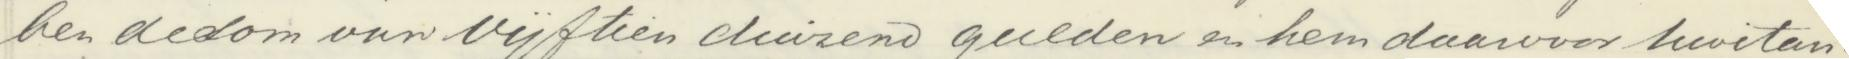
ben de som van vijftien duizend gulden en hem daarvoor kwitan
